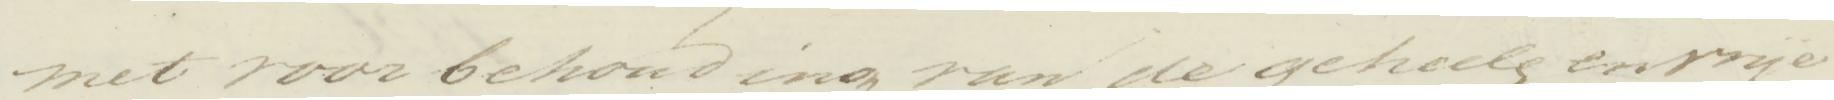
met voor behouding van de geheele en vrije
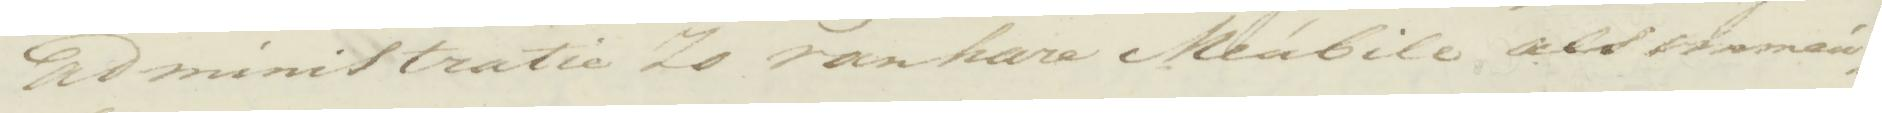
administratie zo van hare Meubile als immeu„
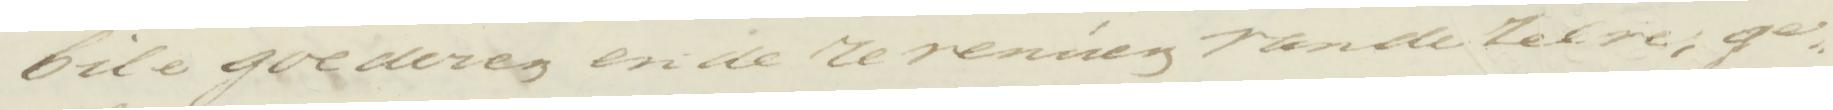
bile goederen en de revenuen van de zelve, ge„
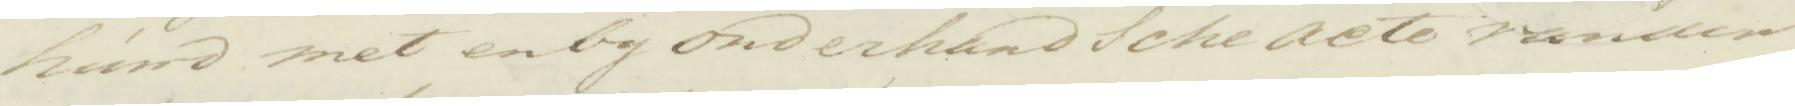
huwd met en by onderhandsche acte vanden
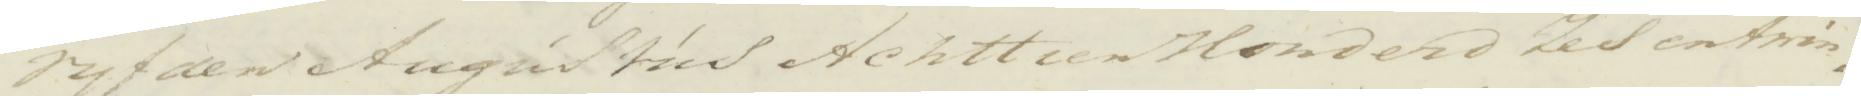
vyfden Augustus Achttien Honderd Zes en twin„
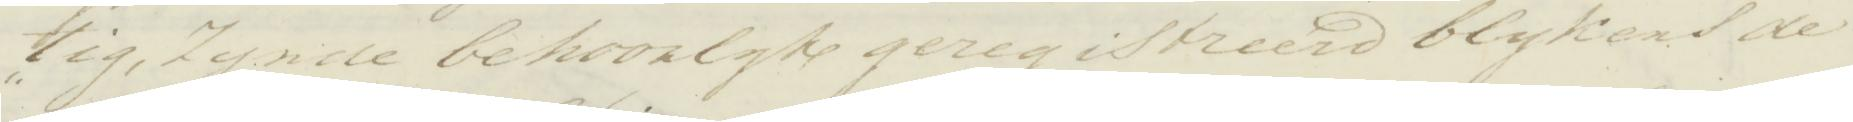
„tig, Zynde behoorlyk geregistreerd blykens de
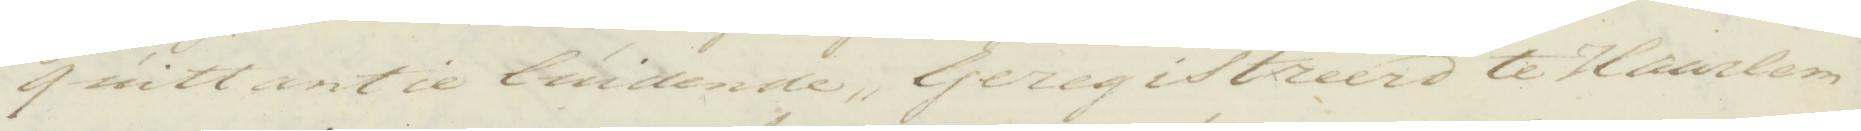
quittantie luidende, Geregistreerd te Haarlem
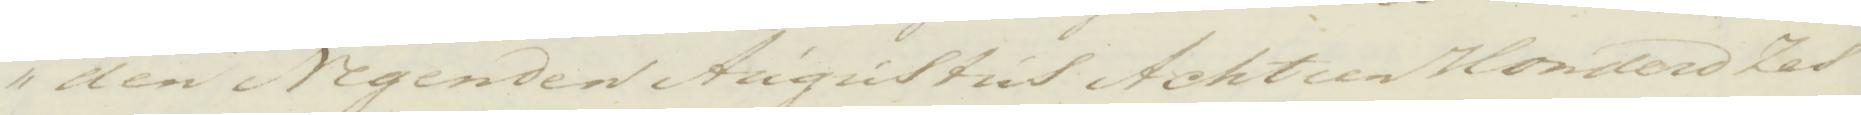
„den Negenden Augustus Achtien Honderd Zes
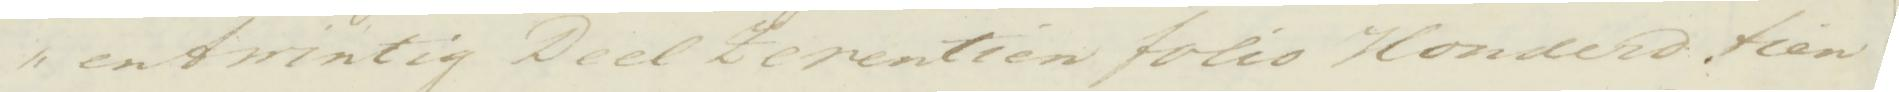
„ en twintig Deel Zeventien folio Honderd tien
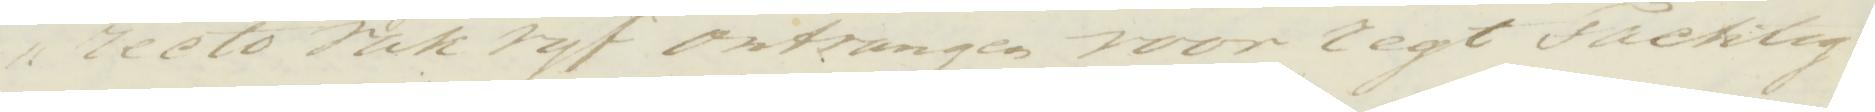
„ recto vak vyf ontvangen voor regt Tachtig
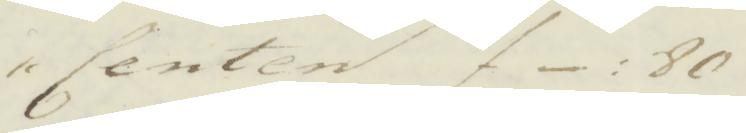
„ Centen ƒ — :c80
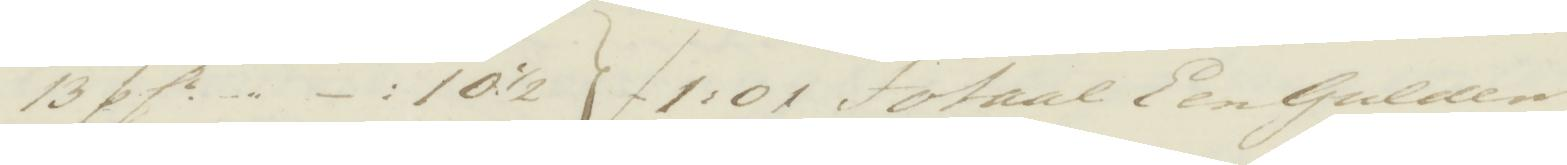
13 pC.t - „ —: 10½ ƒ 1: 01 Totaal Een Gulden
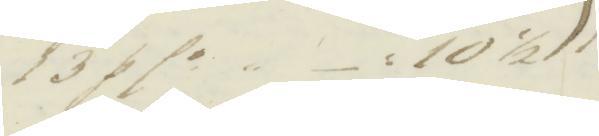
13 pC.o „ —: 10 ½
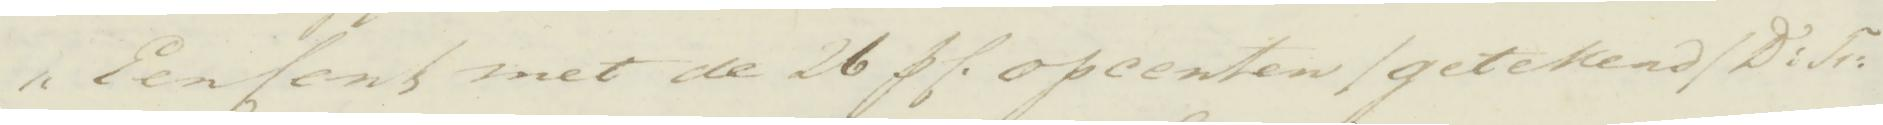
„ Een Cent met de 26 pC. opcenten /getekend/ D: F:
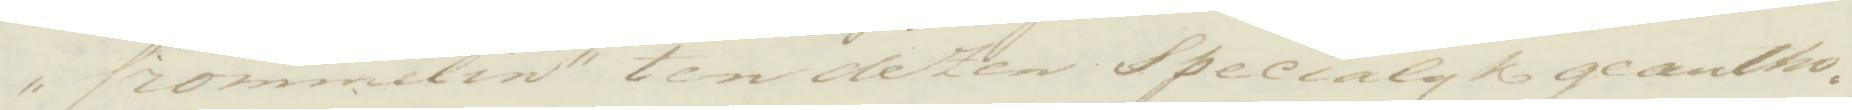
„ Crommelin ten dezen specialyk geautho„
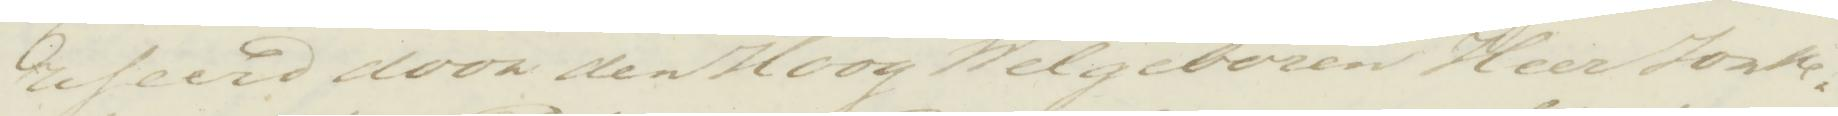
riseerd door den Hoog Welgeboren Heer Jonk„
